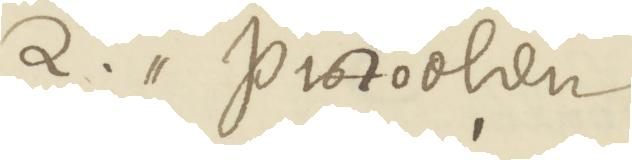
2. „ pistoelen
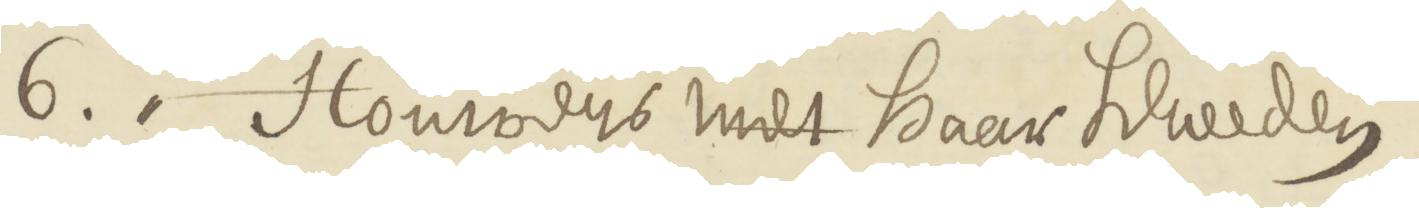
6. „ Houwers met Haar Scheeden
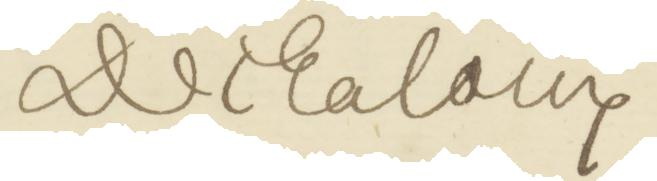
De chaloup
